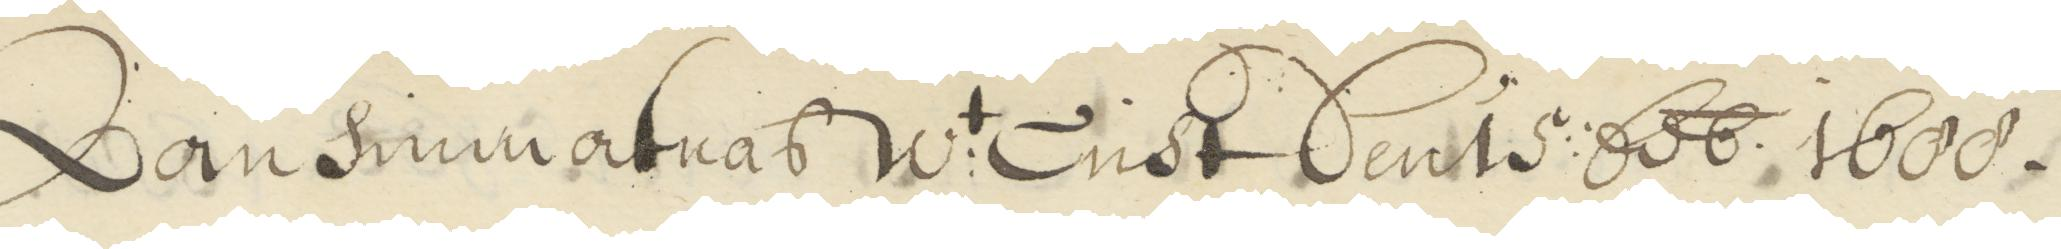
Van sumatras W:t Cust den 15: feb. 1688.
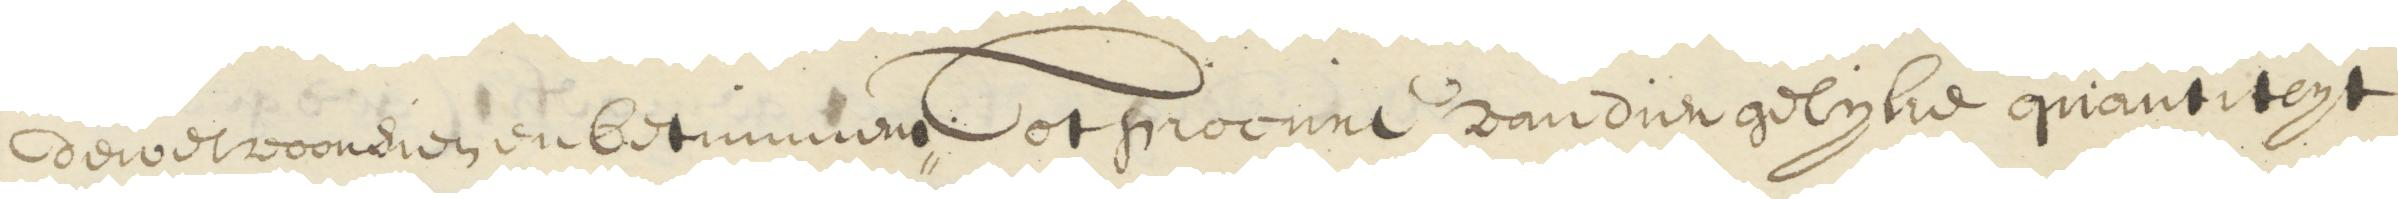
dewel voorsien en betimmert„ Tot procure van dier gelijke quantiteijt
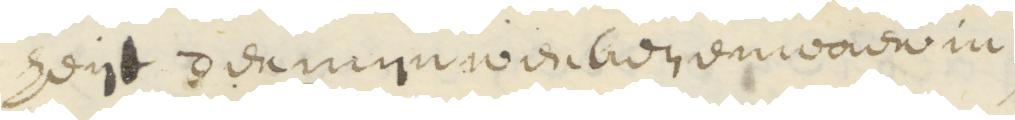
heijt der mijn werken enwaer in
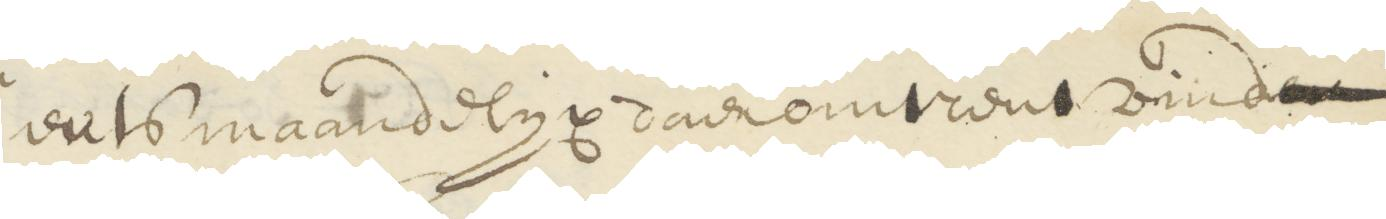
ents maandelijx daer omtrent vind
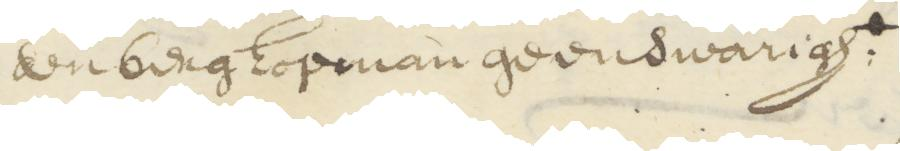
den berghopman geen swarigh:t
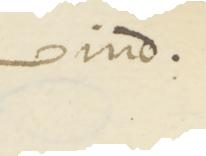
vind.
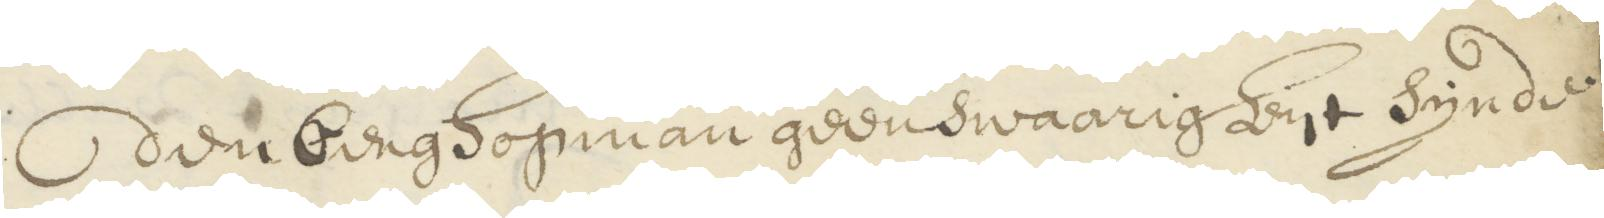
den berghopman geen swaarighijt sijnde
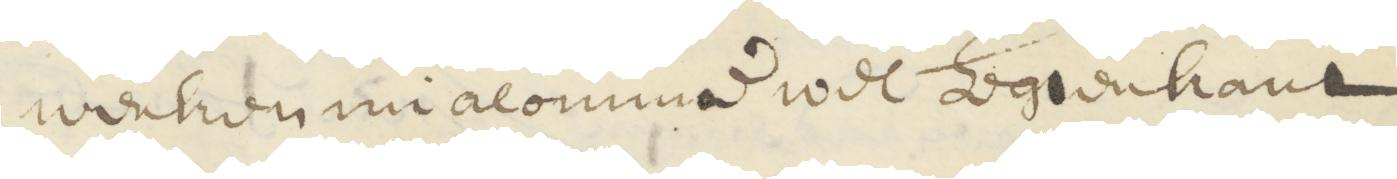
werken nu al omme wel hegtenkant
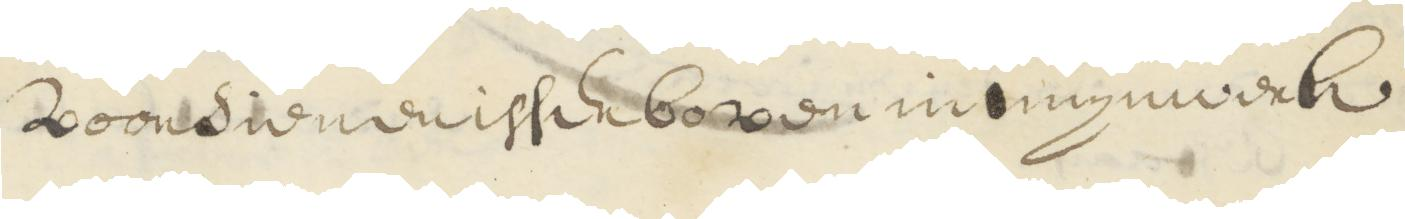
voorsien en isser boven int mynwerk
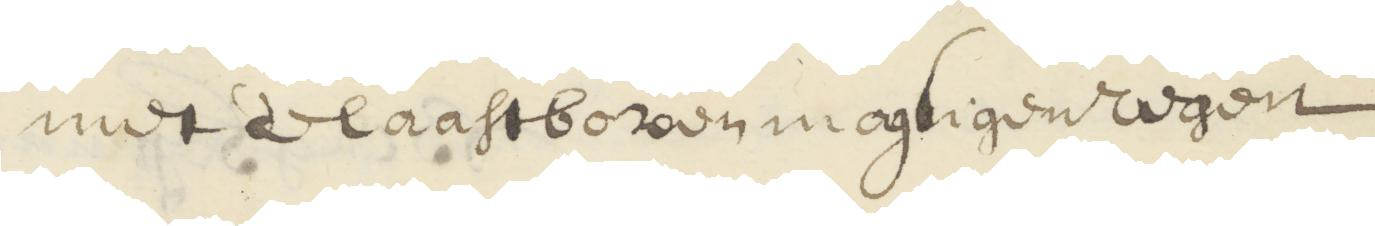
met de laast boven magtigen regen
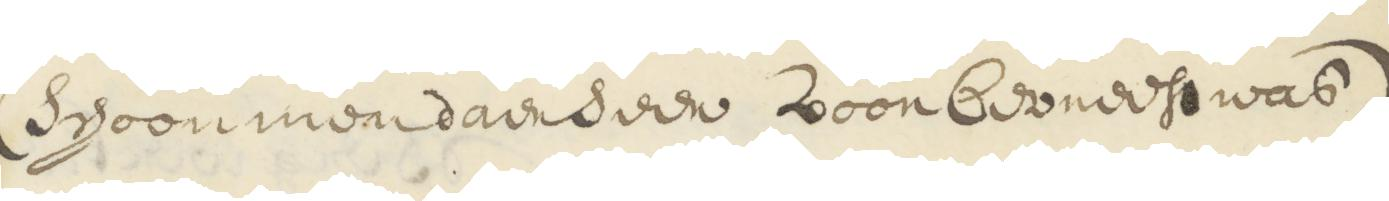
(schoon men daer seer voor bevreest was)
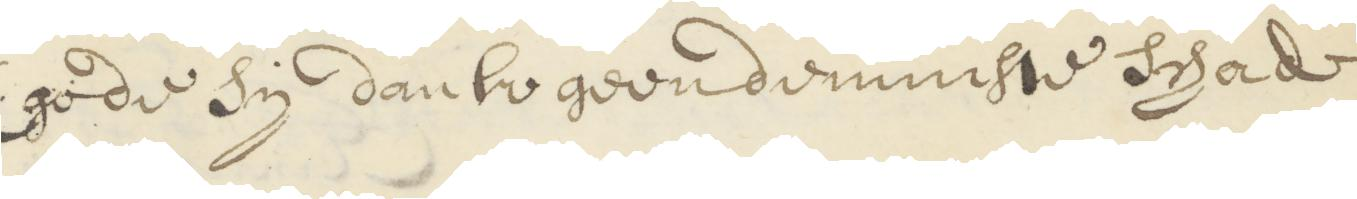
(gode sij dank geen de miste schade
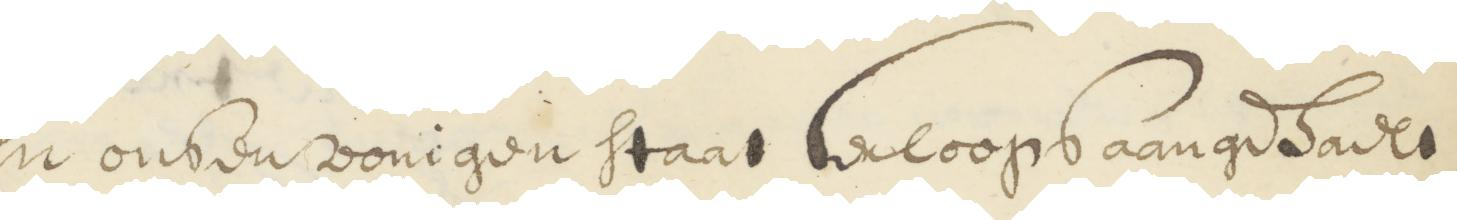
In onsen vorigen staat terloops aangehaelt,
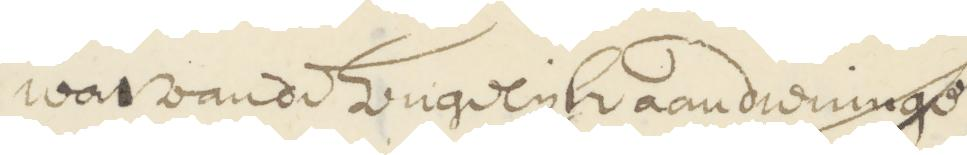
wat vande Engelijk aan dieninge
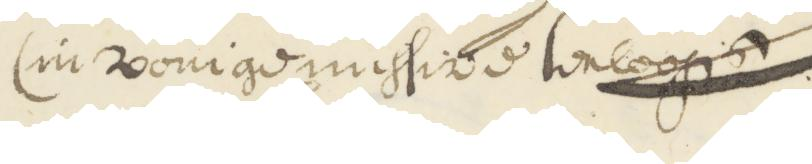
(in vorige missive terloops
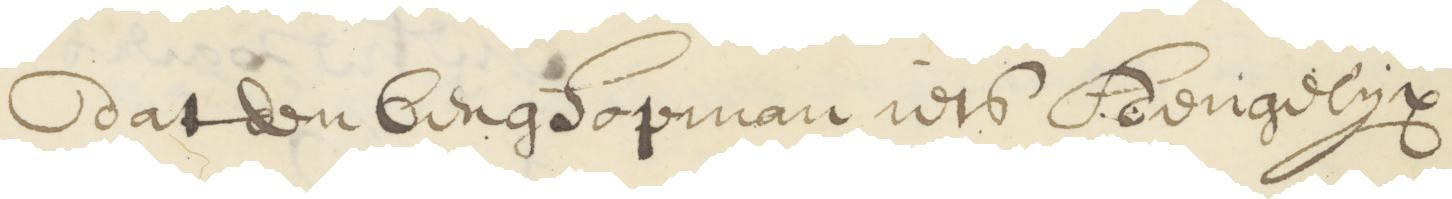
dat den berghopman iets heugelijx
